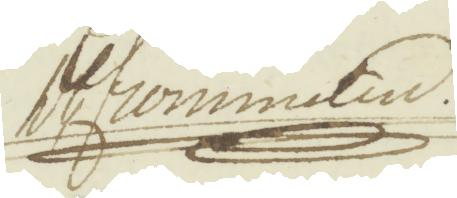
D. F Crommelin.
